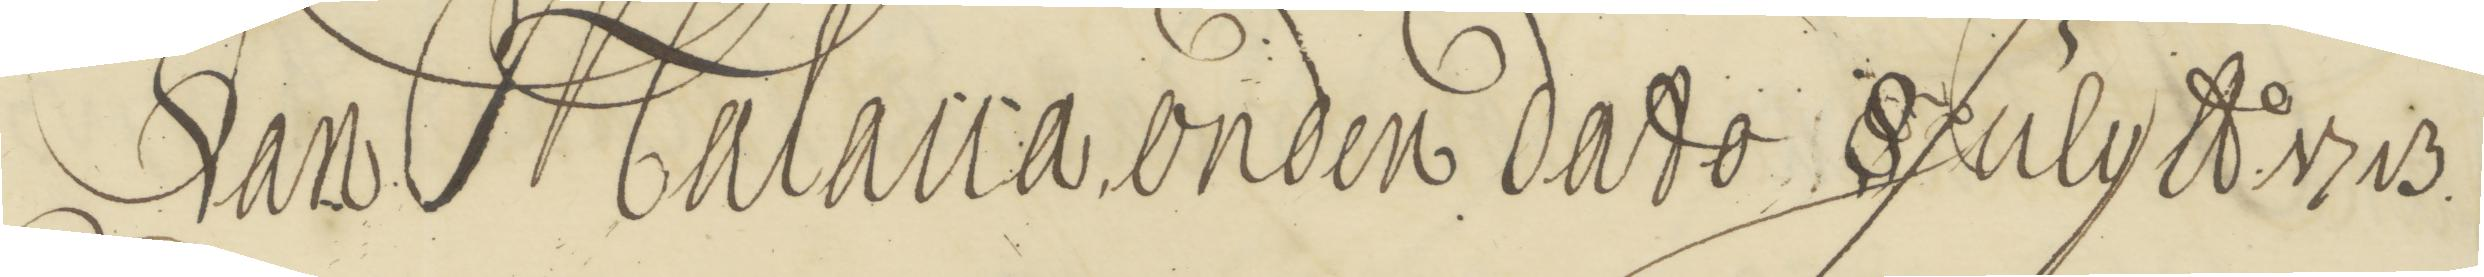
Van Malacca, onder dato: 8' July A:o 1713.
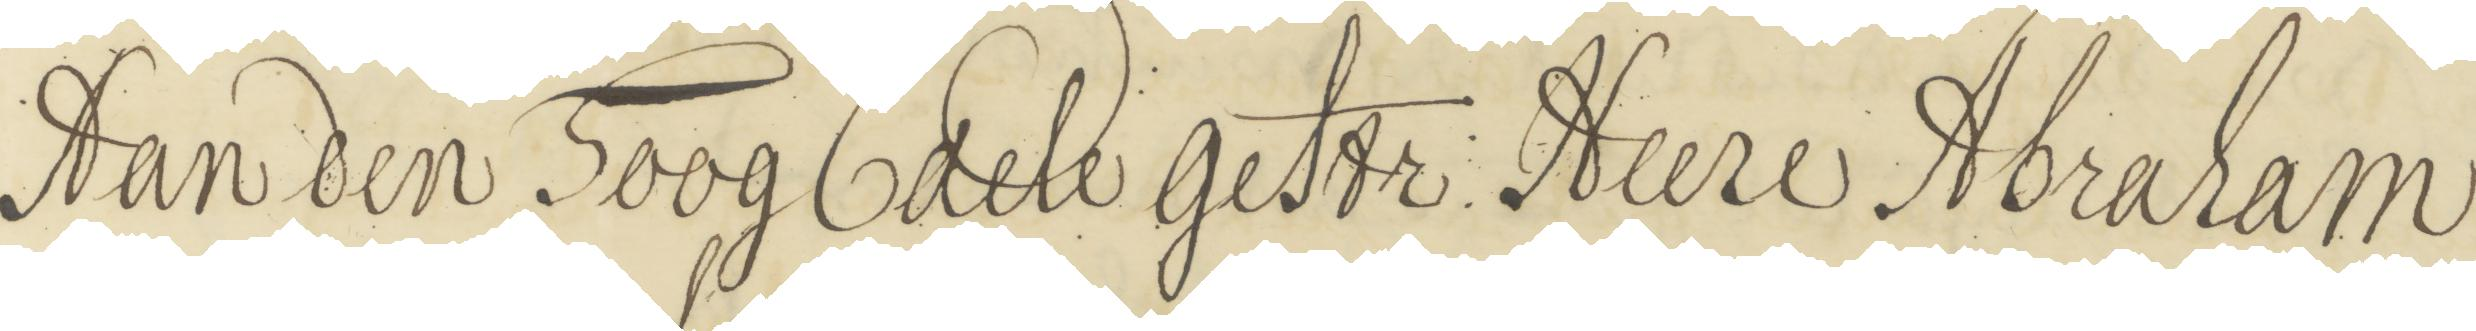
Aan den hoog Edels gestr: Heere Abraham
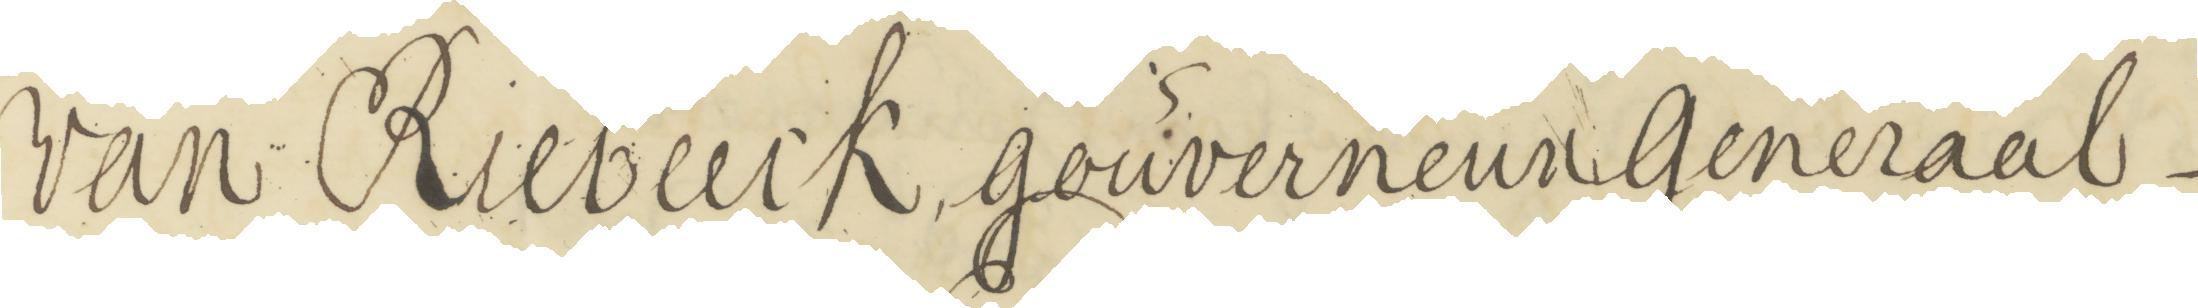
Van Riebeeck, gouverneur generaal
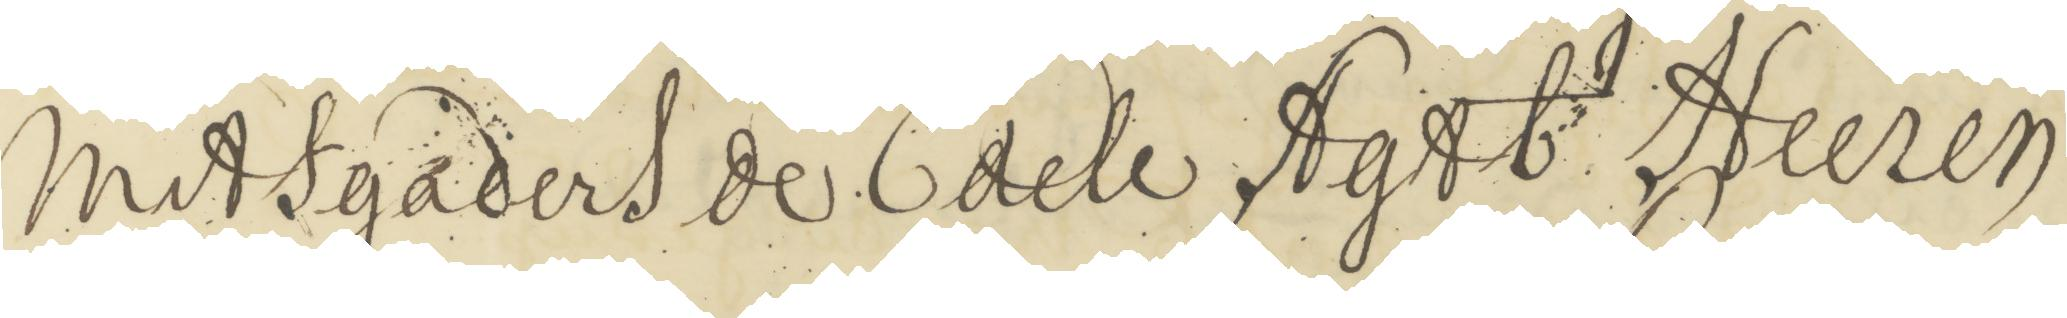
mitsgaders de Edele Agtb: Heeren
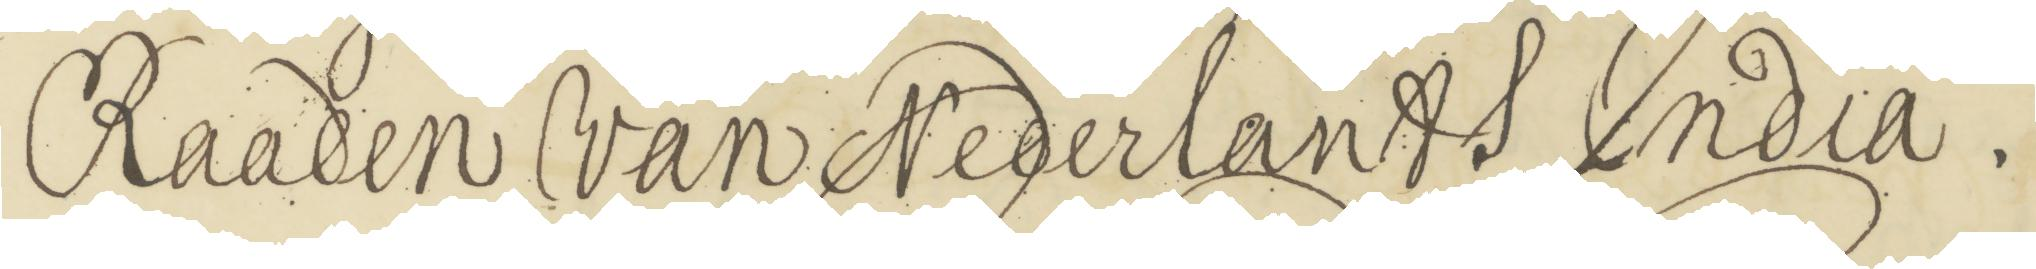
Raaden van Nederlants Jndia.
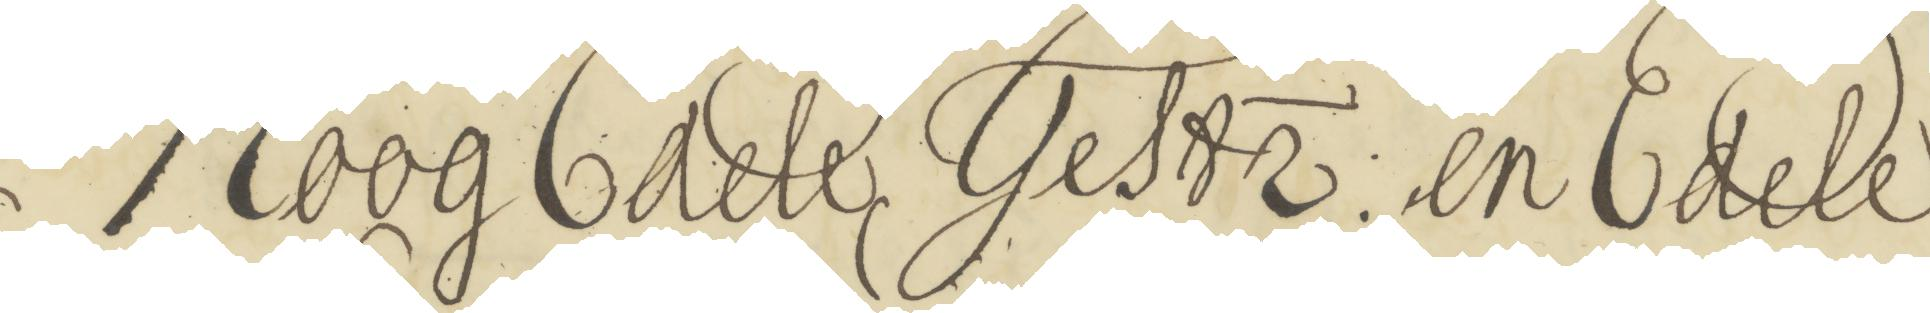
Hoog Edele Gestr: en Edele
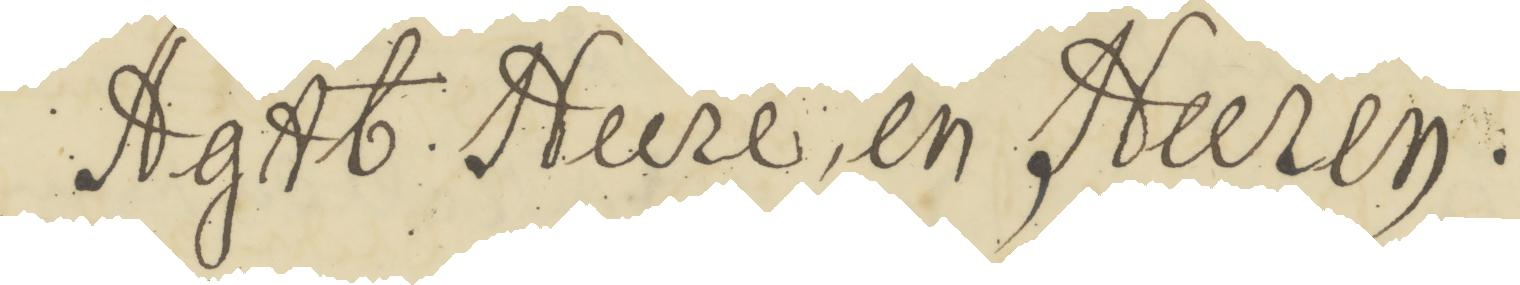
Agtb: Heere, en Heeren.
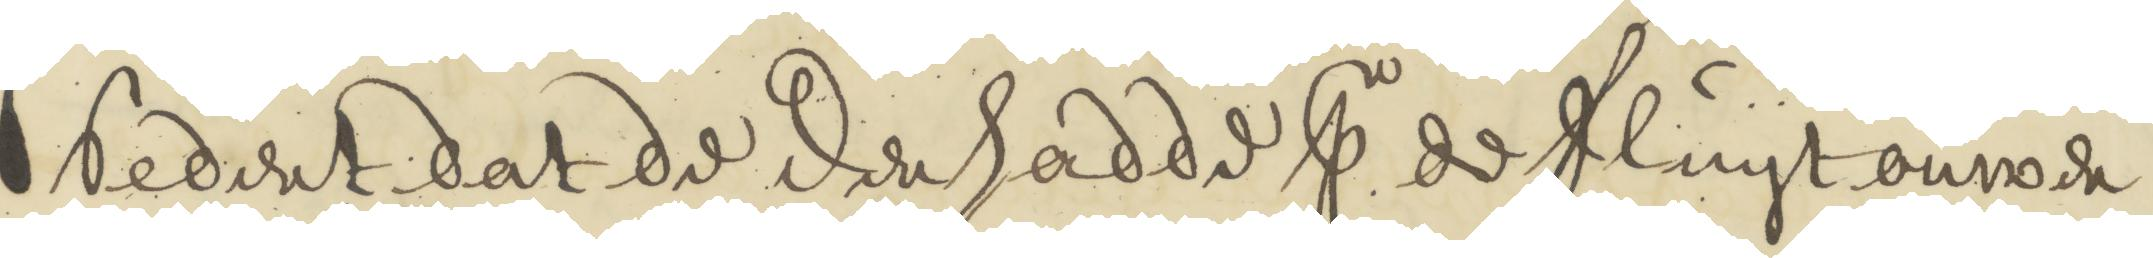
t Sedert dat de Eer hadde p:r de fluijt ouwer
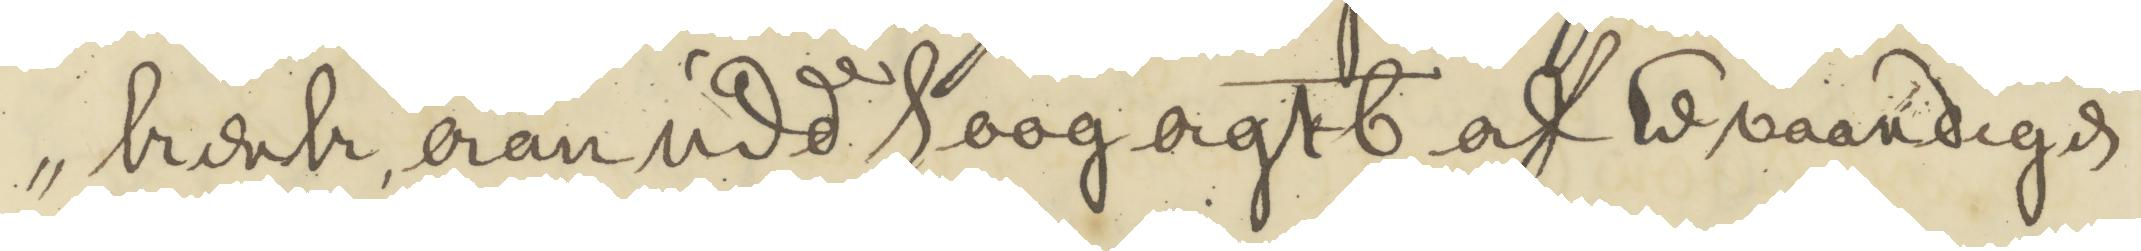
„kerk, aan uEd:e hoog agtb: af te vaardigen
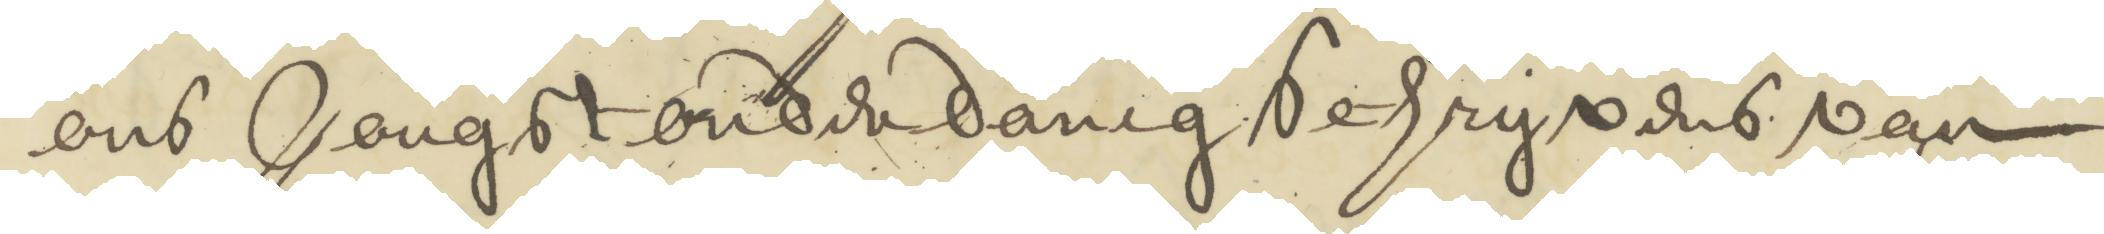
ons Jongst onderdanig schrijvens van
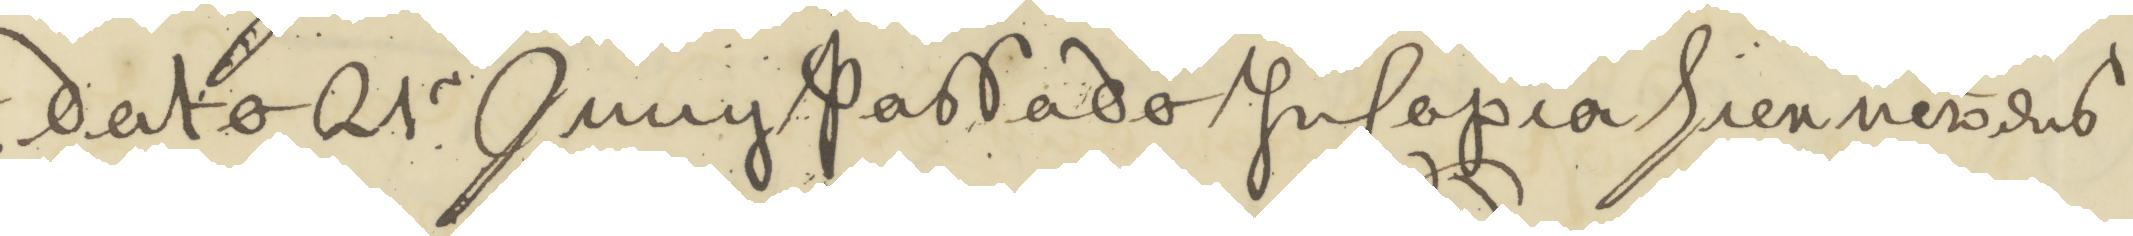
dato 21.' Juny Passado Jn Copia hier nevens
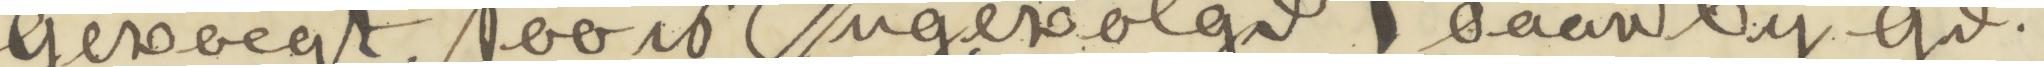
gevoegt, Soo is Jngevolge 1 daar bij ge.
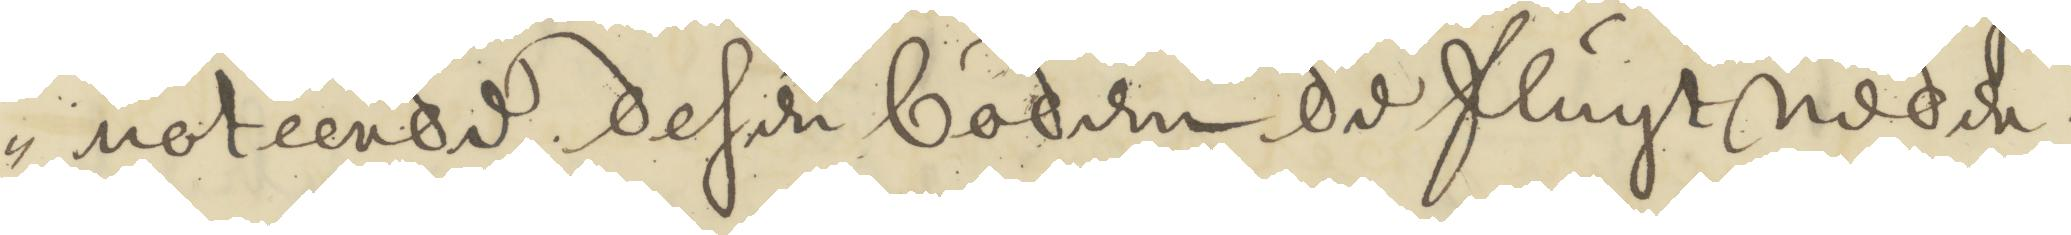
„noteerde, desen bodem de fluijt neder
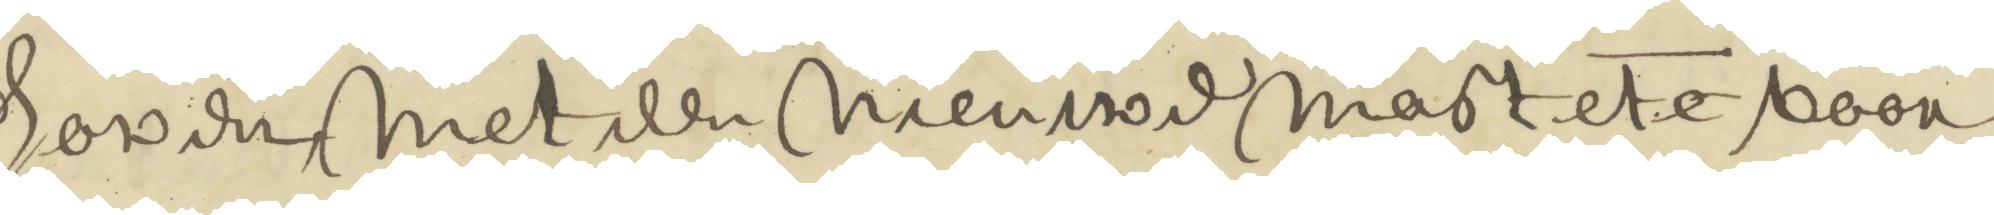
hoven, met een nieuwe mast etc voor
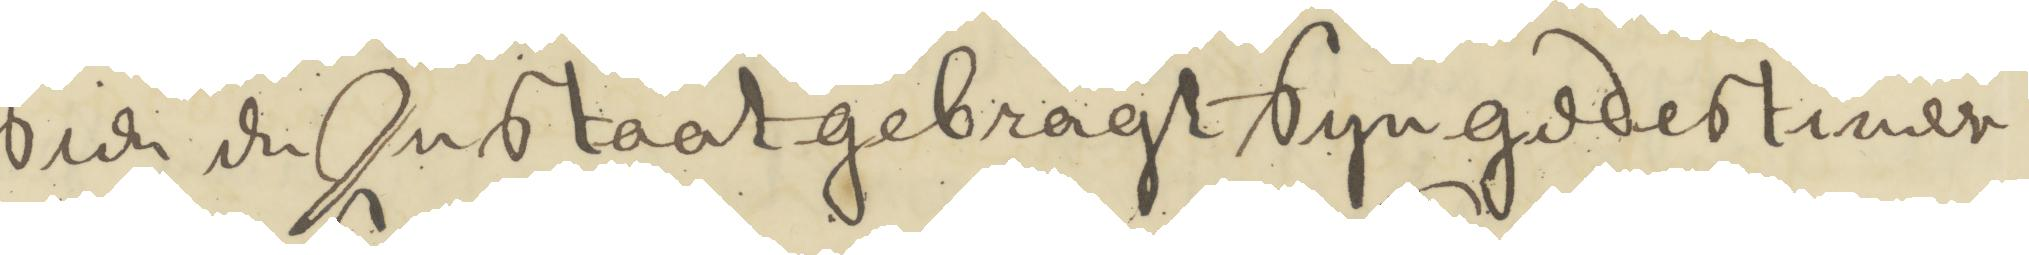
Sien en Jnstaat gebragt Sijn gedestineer
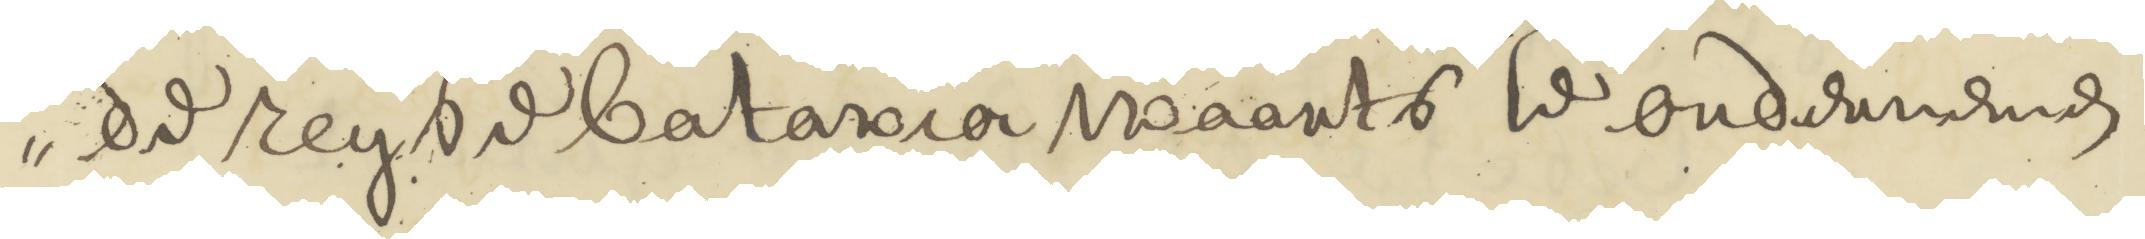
„de reijse batavia waarts te ondernemen
